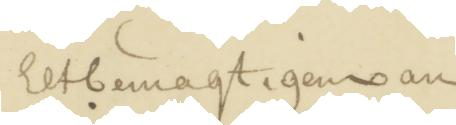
het bemagtigen van
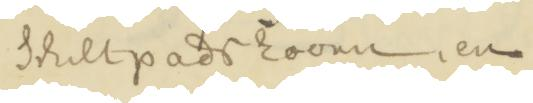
schiltpadshoorn, en
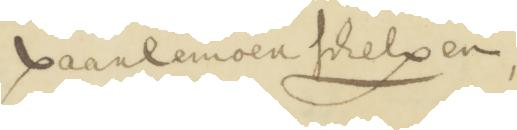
paarlemoer schelpen,
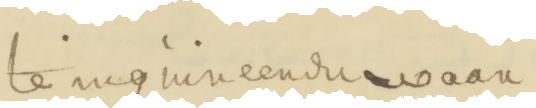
te inquireeren waar
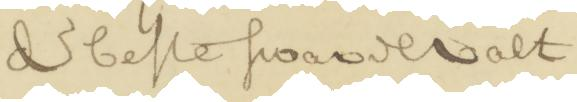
de beste swavelvalt.
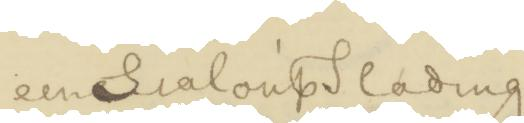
een sialoups lading
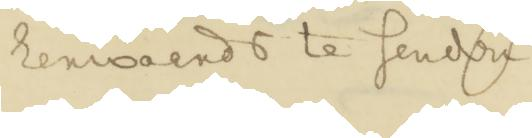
herwaerds te senden
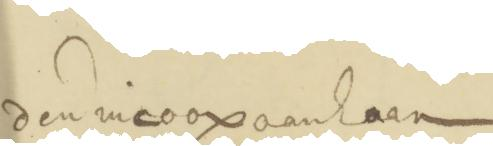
den incoop aanhaar
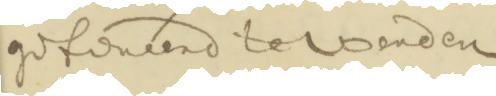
gefereerd te werden.
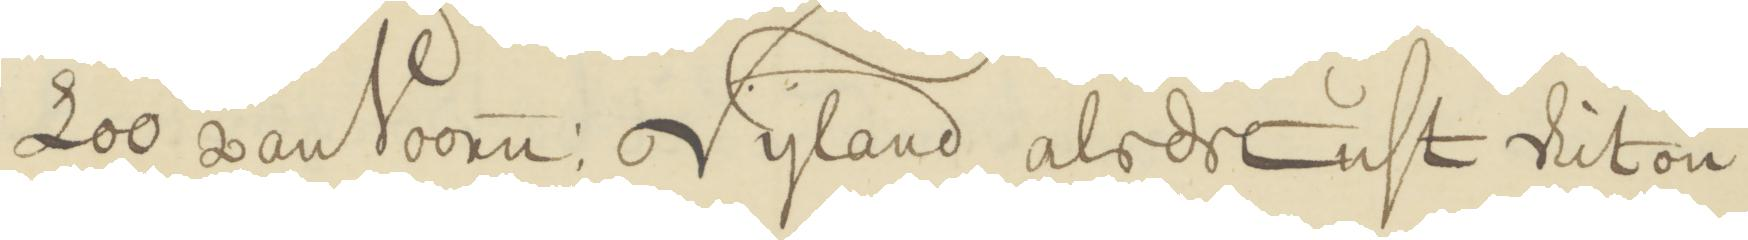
zoo van Voorn: Eijland alsdeCust chitou
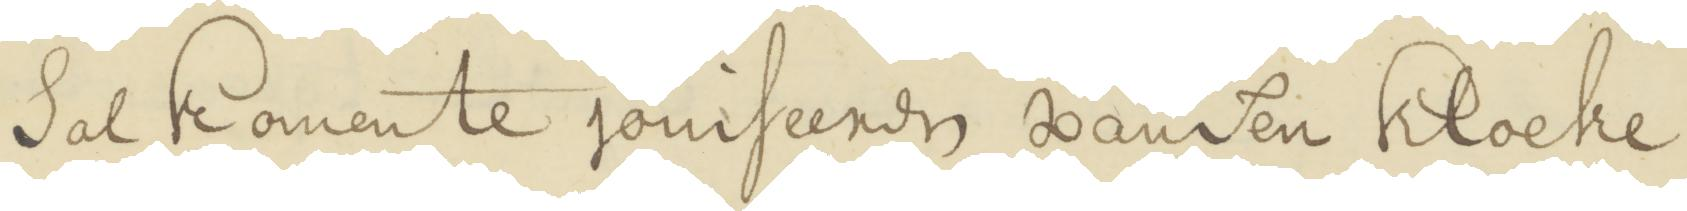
sal komente jouiseeren vanten kloeke
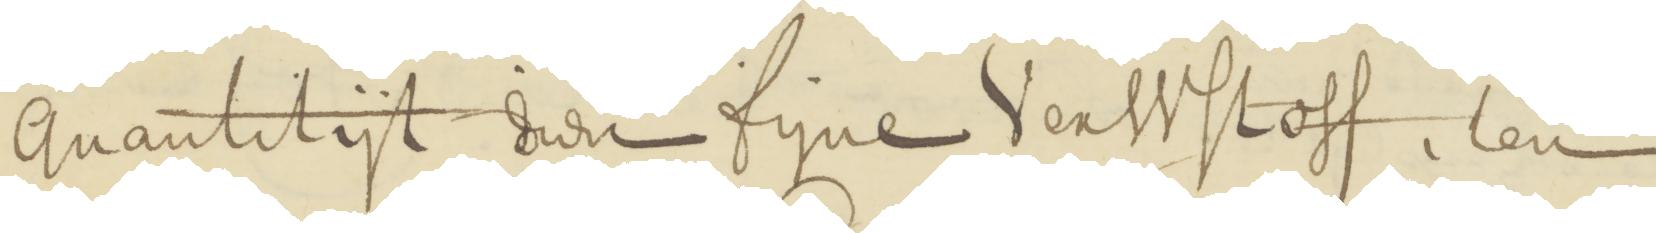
quantitijt dien fijne Verwstoff, ten
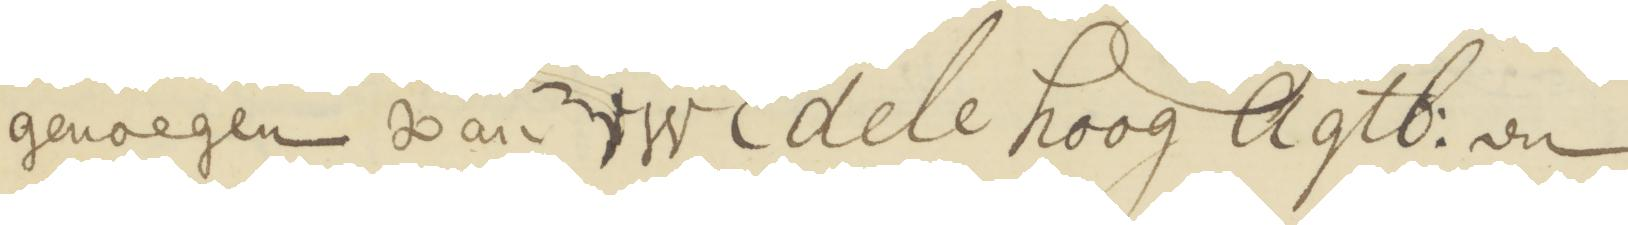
genoegen van UW. Edele hoog Agtb:re en
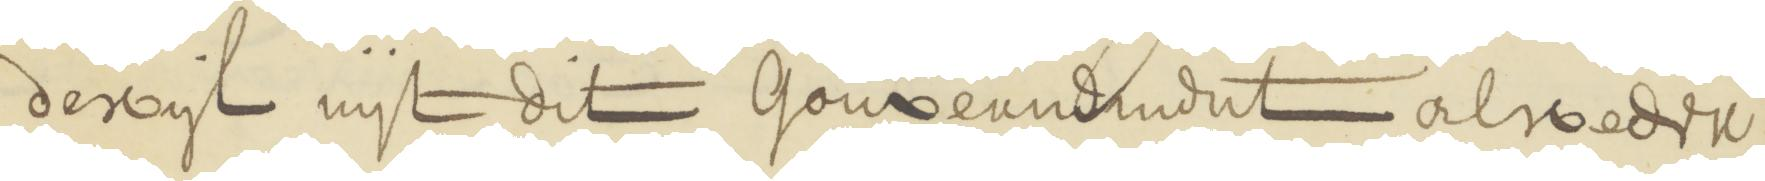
dewijl uijt dit gouvernement alweder
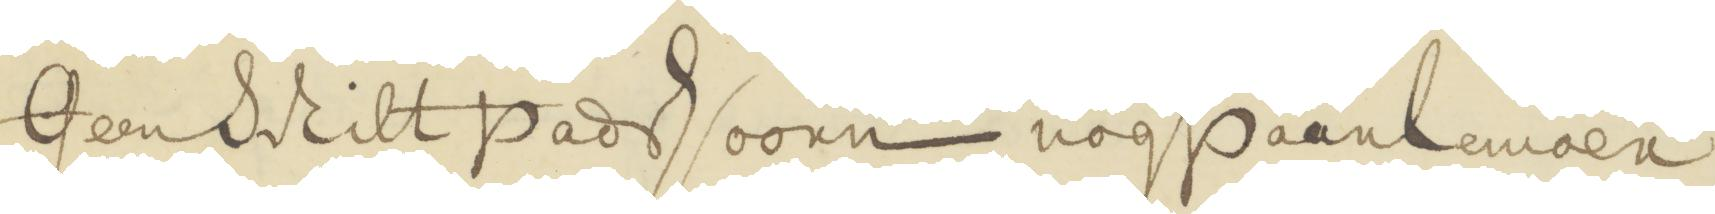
Geen schiltpadhoorn nog Paarlemoer
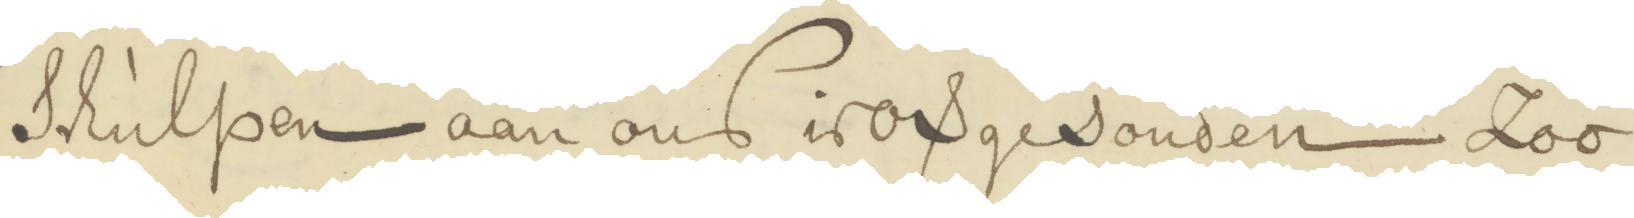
schulpen aan ons is overgesonden Zoo
